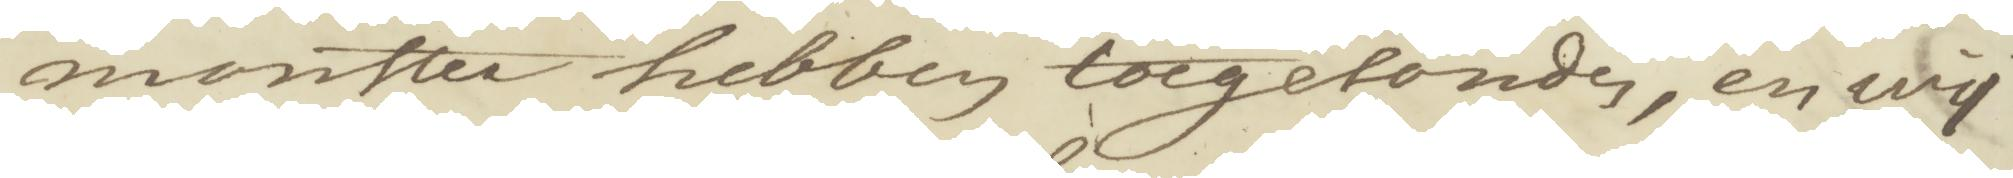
monster hebben toegesonden en wij
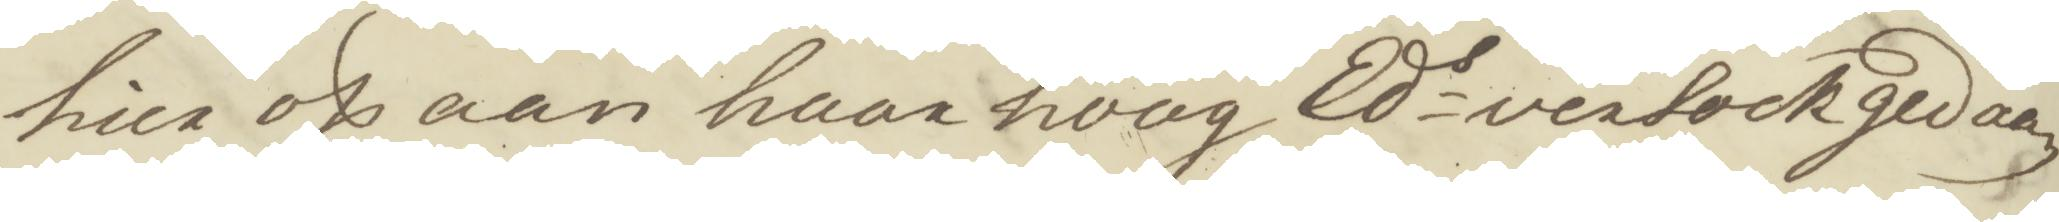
hier op aan haar hoog Ed=s versoek gedaan
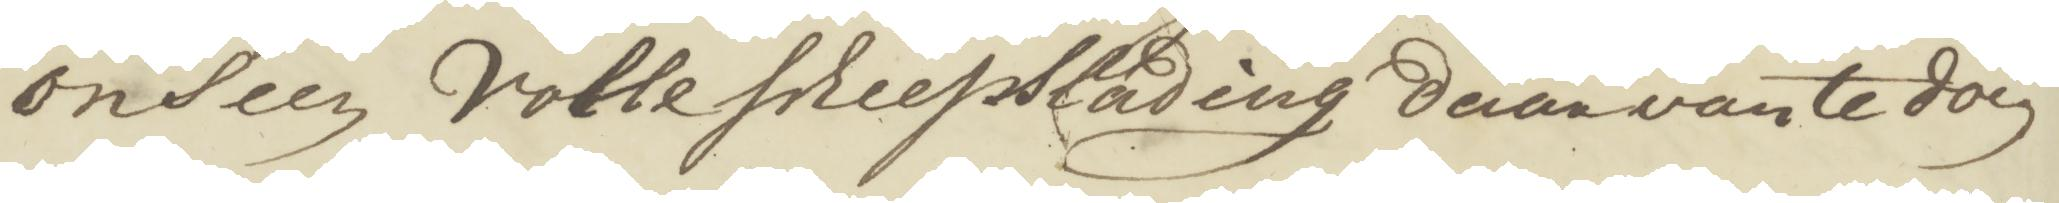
ons een volle scheepslading daar van te doen
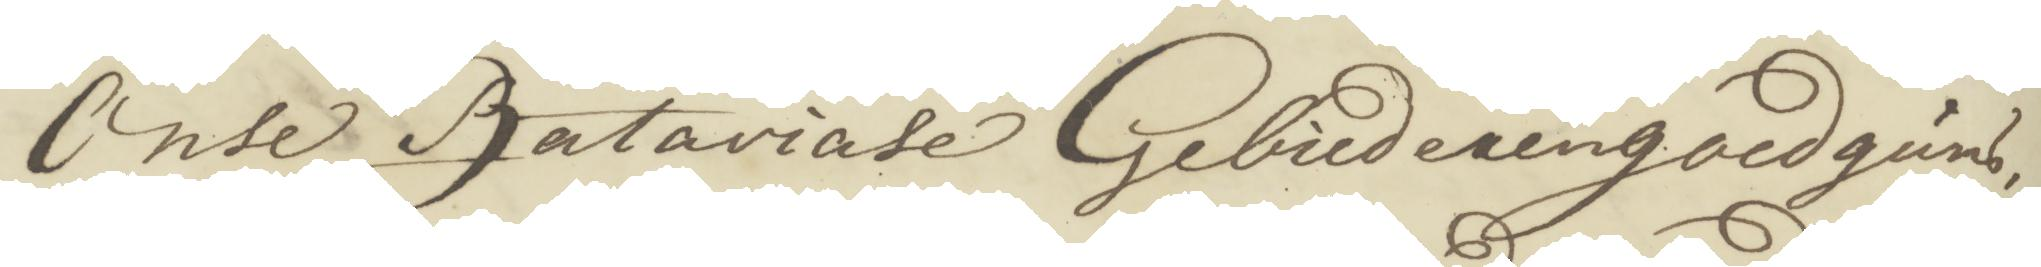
Onse Bataviase Gebiederen goedguns„
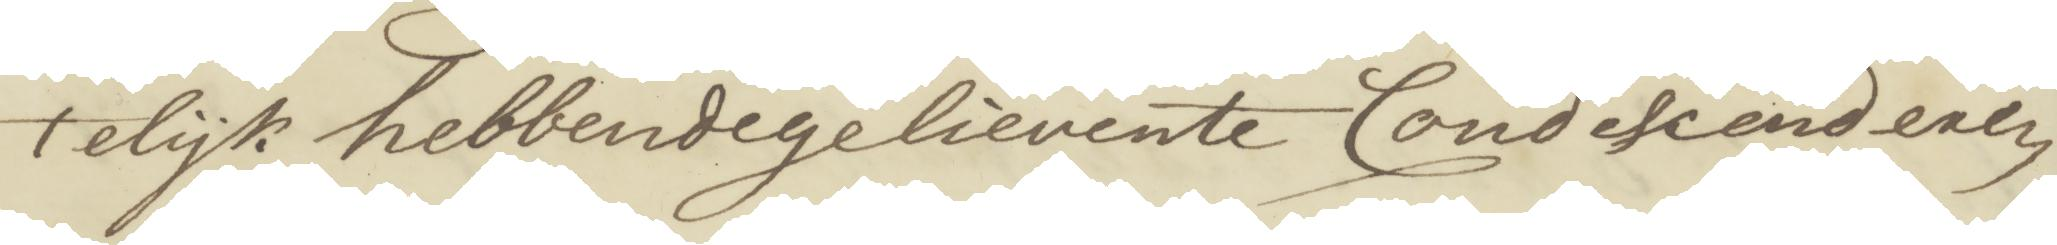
telijk hebbende gelievente Condescenderen
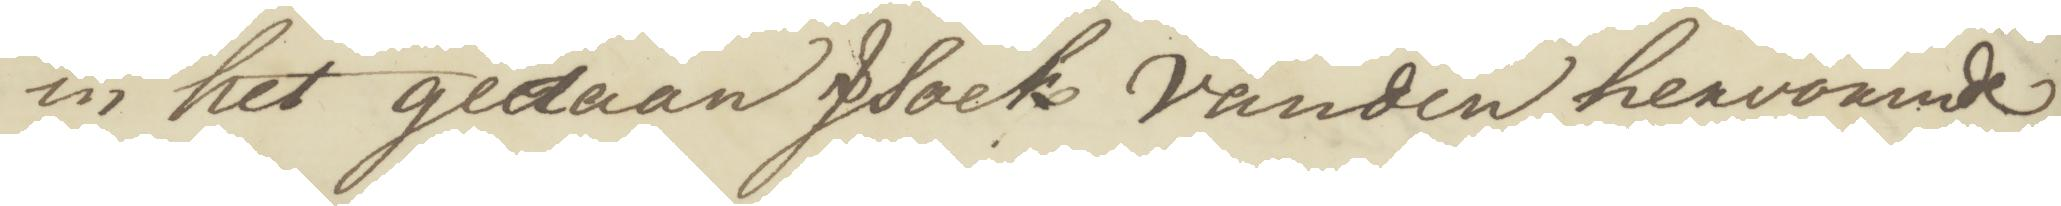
in het gedaan versoek vanden hervormde
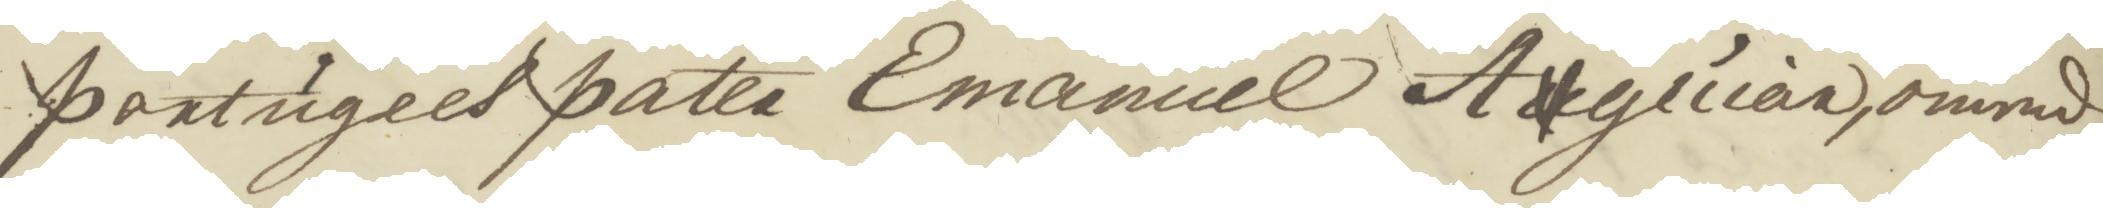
portugees pater Emanuel Avguiar, omme
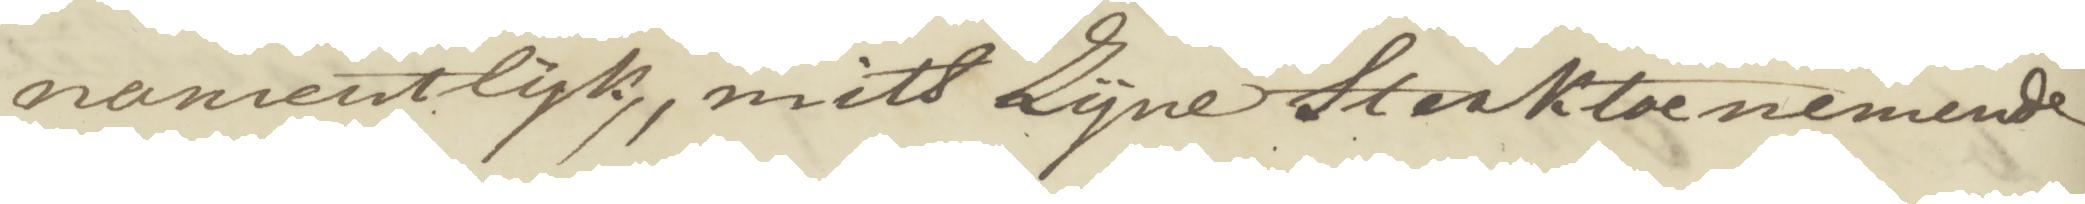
namentlijk, mits zijne sterk toenemende
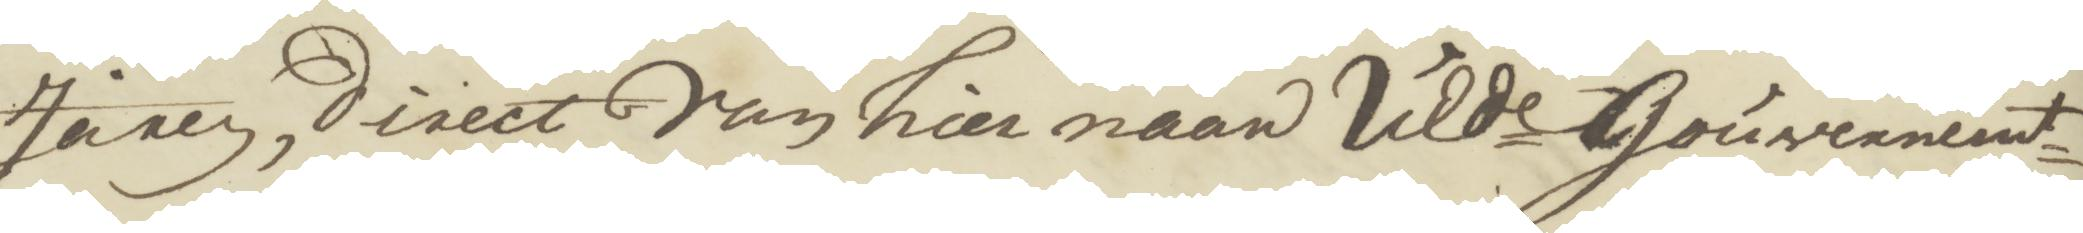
Jaren, direct van hier naar UEd=e Gouvernem=t
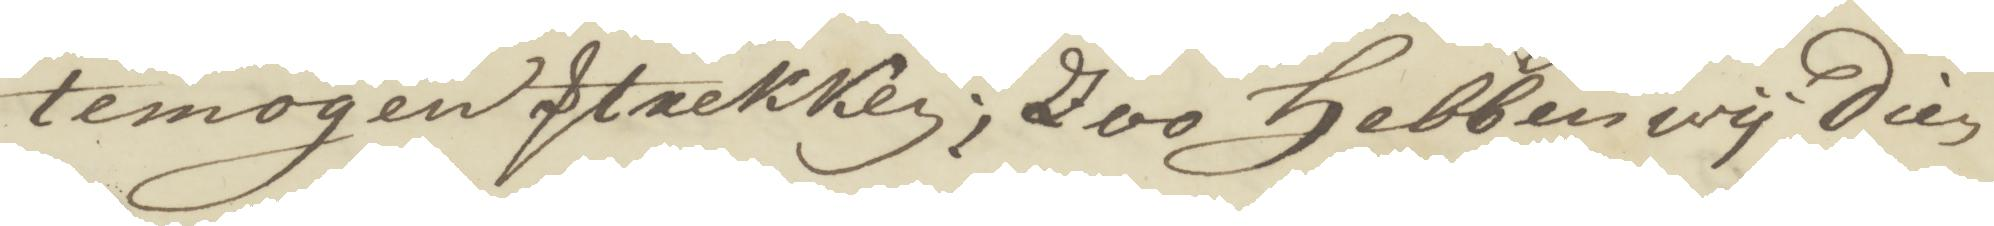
te mogen vertrekken; zoo hebben wij dien
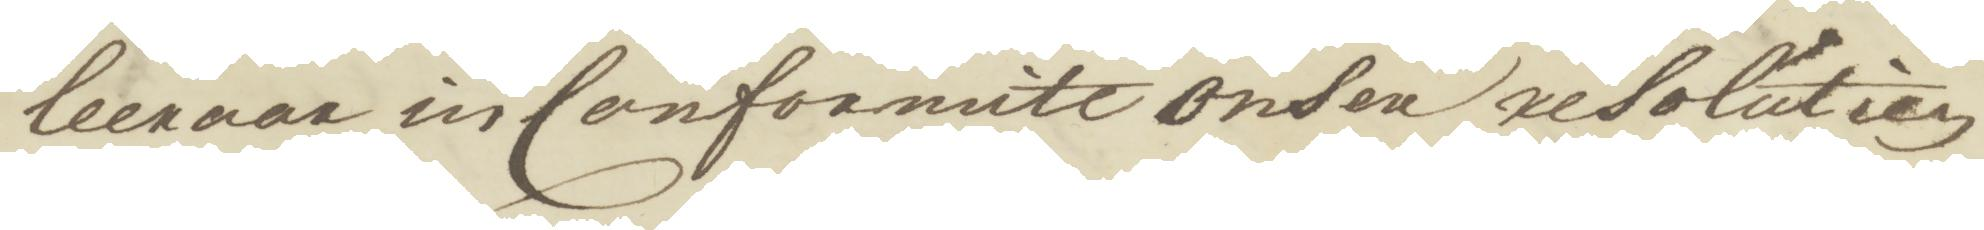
leeraar in Conformite onser resolutien
